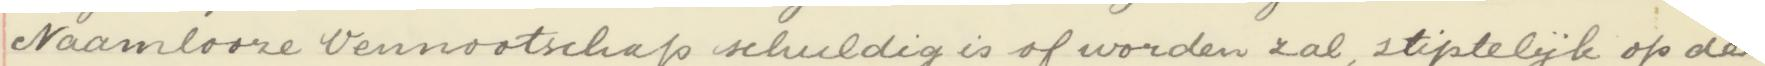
Naamlooze Vennootschap schuldig is of worden zal, stiptelijk op de
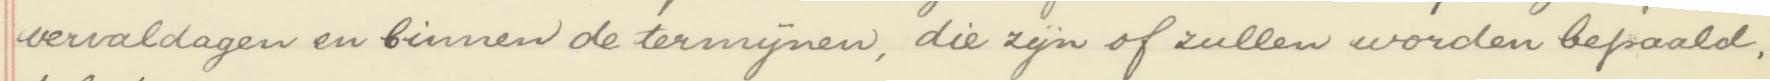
vervaldagen en binnen de termijnen, die zijn of zullen worden bepaald
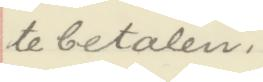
te betalen,
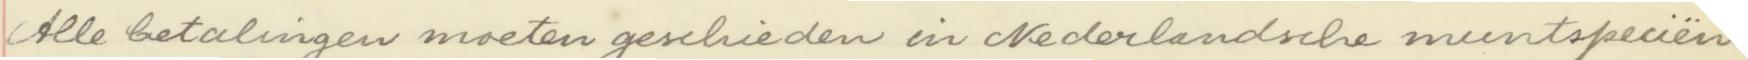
Alle betalingen moeten geschieden in Nederlandsche muntspeciën
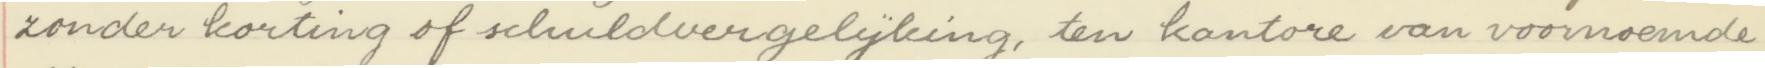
zonder korting of schuldvergelijking, ten kantore van voornoemde
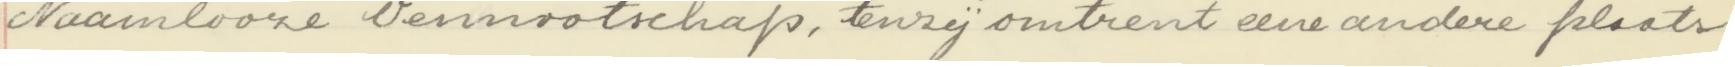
Naamlooze Vennootschap, tenzij omtrent eene andere plaats
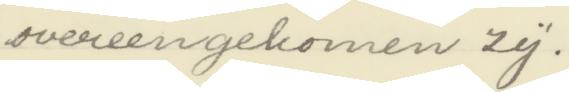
overeengekomen zij
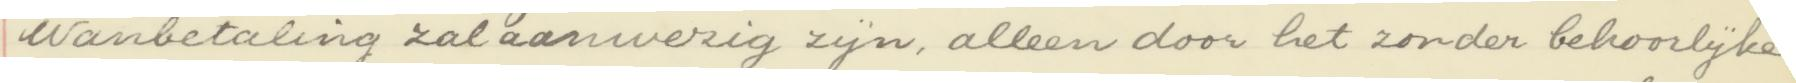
Wanbetaling zal aanwezig zijn, alleen door het zonder behoorlijke
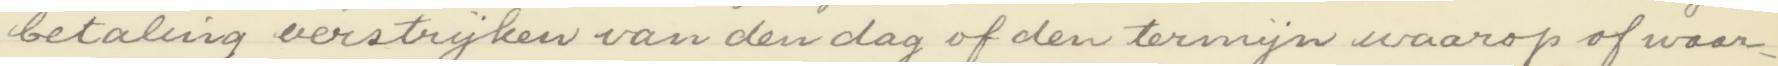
betaling verstrijken van den dag of den termijn waarop of waar
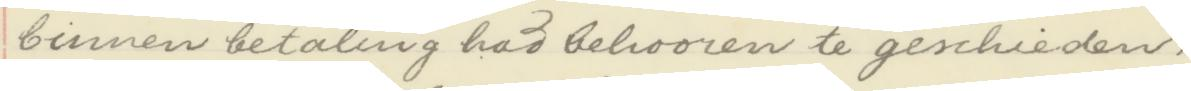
binnen betaling had behooren te geschieden.
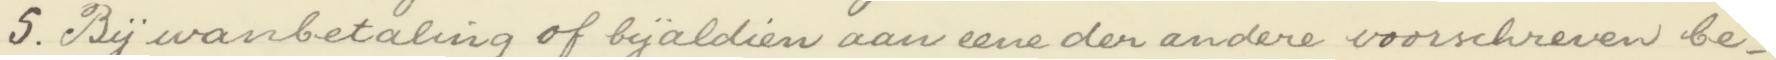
5. Bij wanbetaling of bij aldien aan eene der andere voorschreven be„
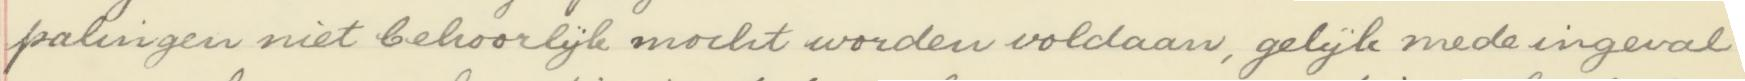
palingen niet behoorlijk mocht worden voldaan, gelijk mede ingeval
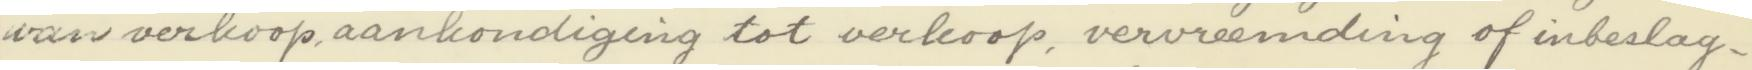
van verkoop, aankondiging tot verkoop, vervreemding of inbeslag=
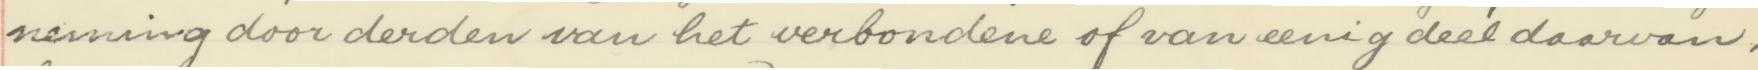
neming door derden van het verbondene of van eenig deel daarvan
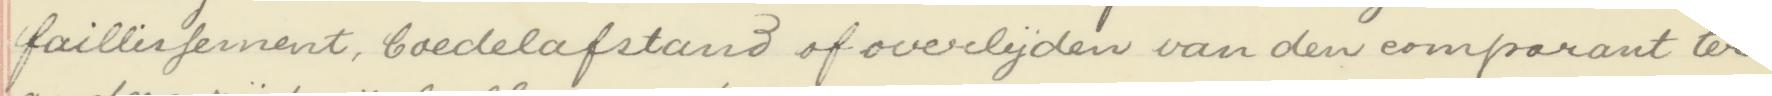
faillissement, boedelafstand of overlijden van den comparant ter
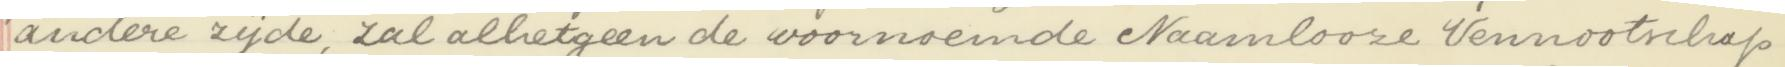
andere zijde, zal alhetgeen de voornoemde Naamlooze vennootschap
